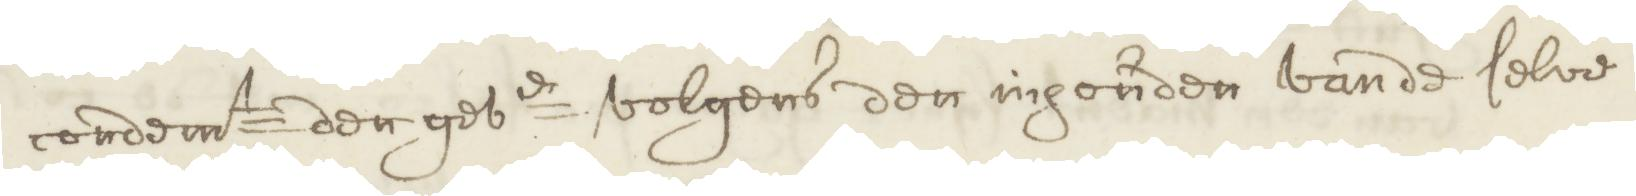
condem=t den gev=e volgens den inhouden vande selve
